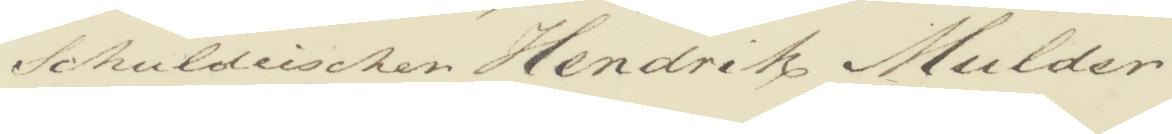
Schuldeischer Hendrik Mulder
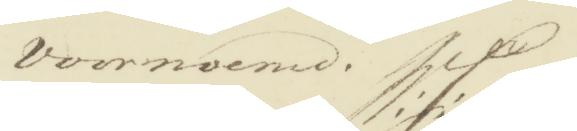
voornoemd. W:S:
